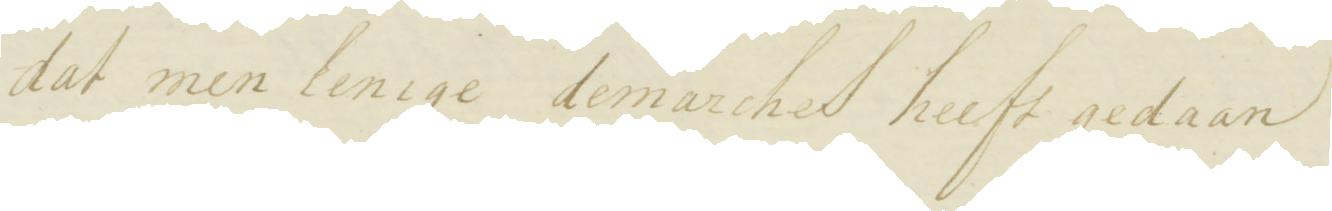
dat men Eenige demarches heeft gedaan
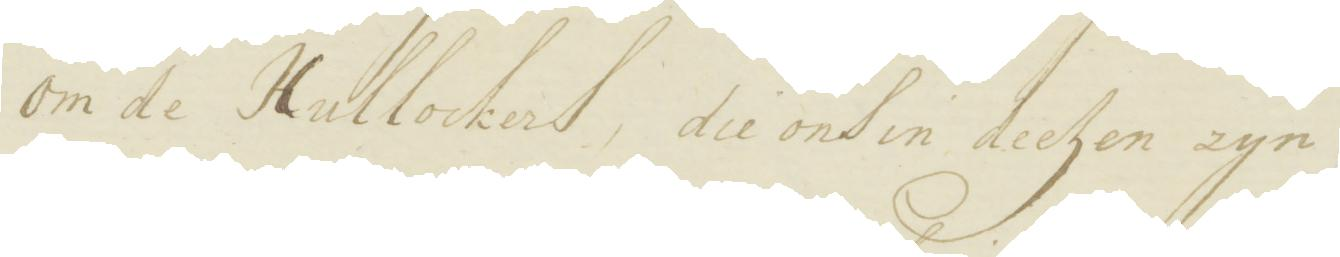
om de Xullockers, die ons in deezen zyn
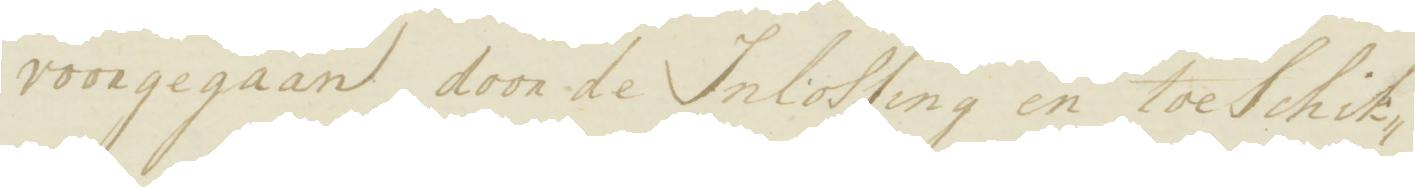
voorgegaan door de Inlossing en toeschik„
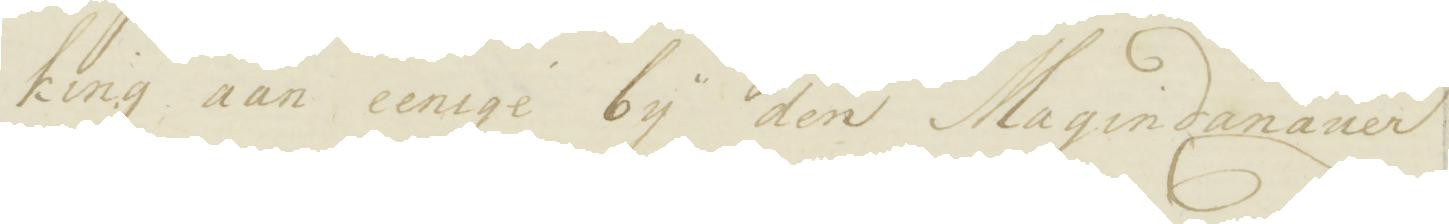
king aan eenige by den Magindanauer
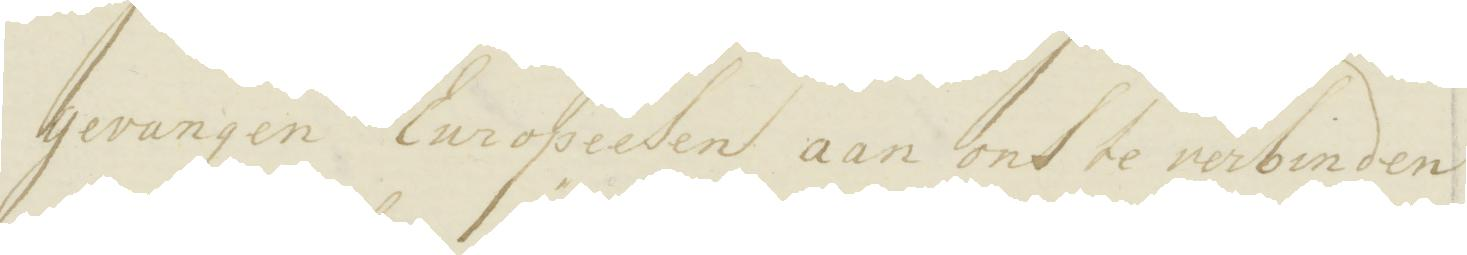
gevangen Europeesen aan ons te verbinden
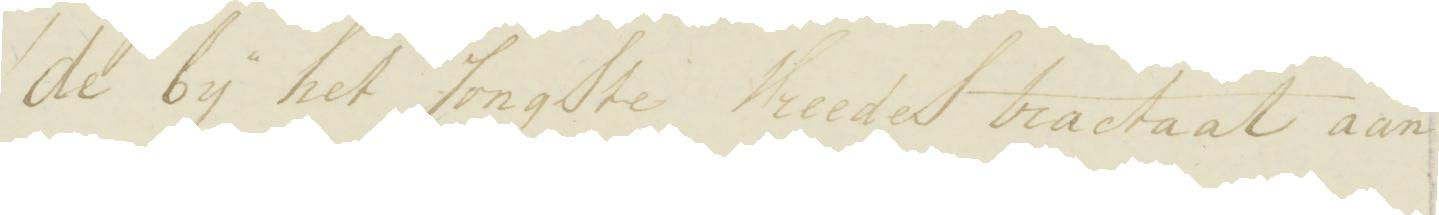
de bij het Jongste Vreedes tractaat aan
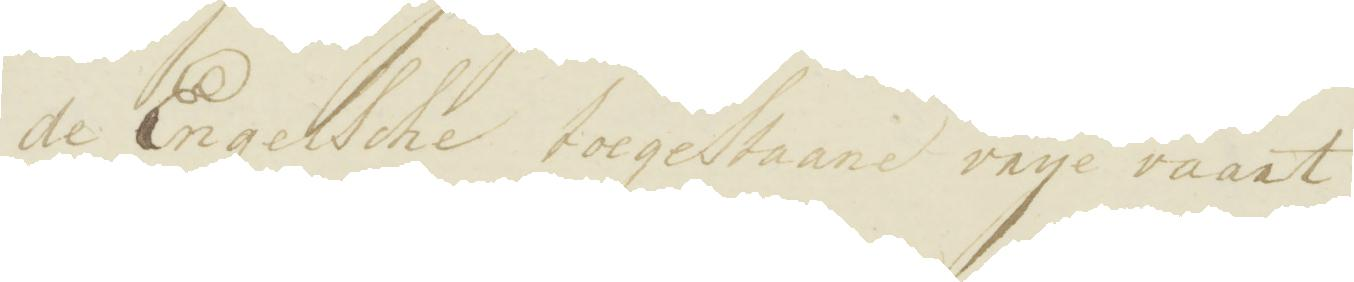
de Engelsche toegestaane vrye vaart
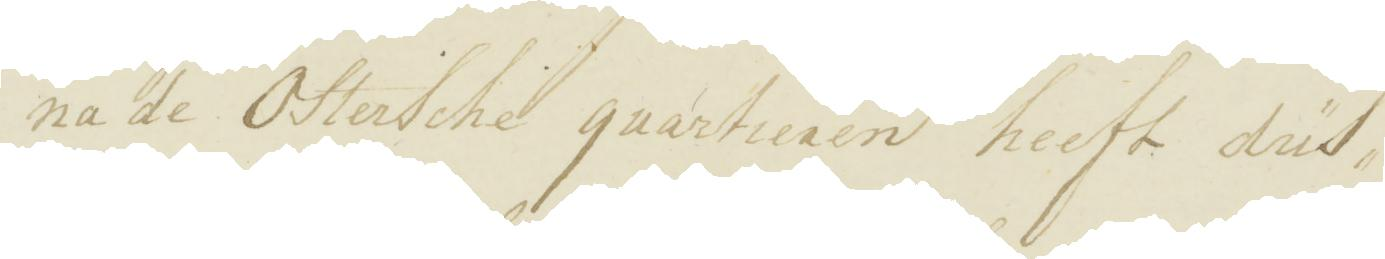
na de Ostersche quartieren heeft dus„
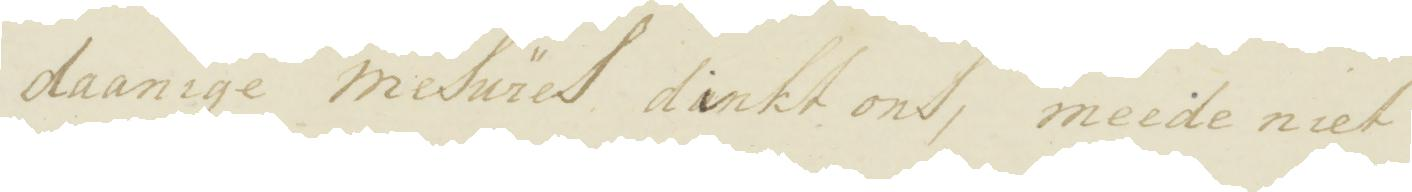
daanige mesures dinkt ons, meede niet
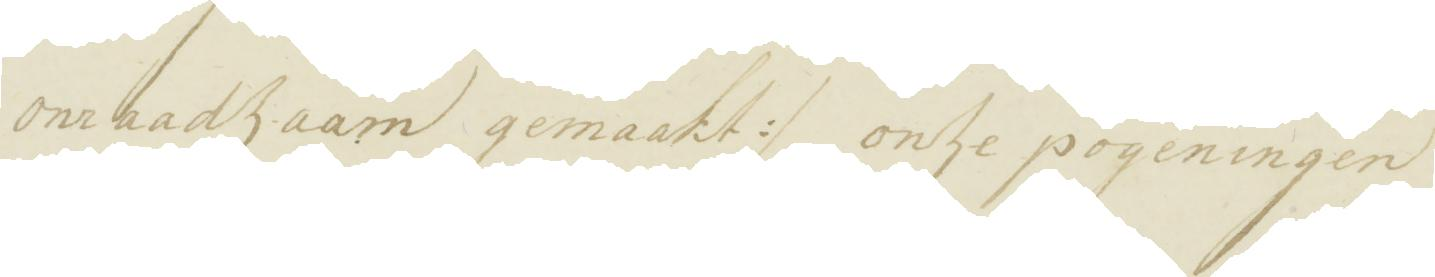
onraadzaam gemaakt:/ onze pogeningen
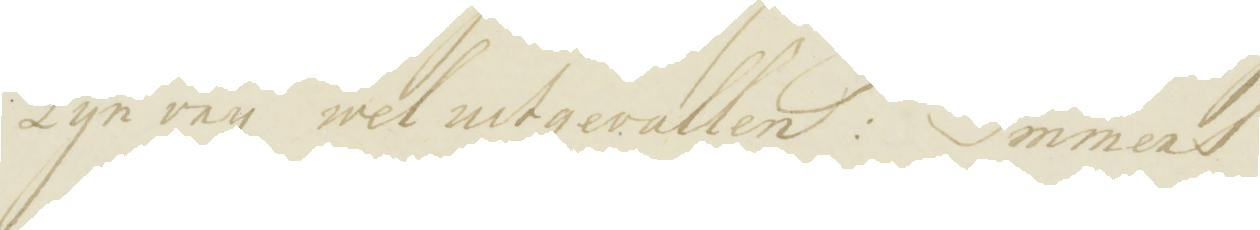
zyn vry wel uitgevallen: Immers
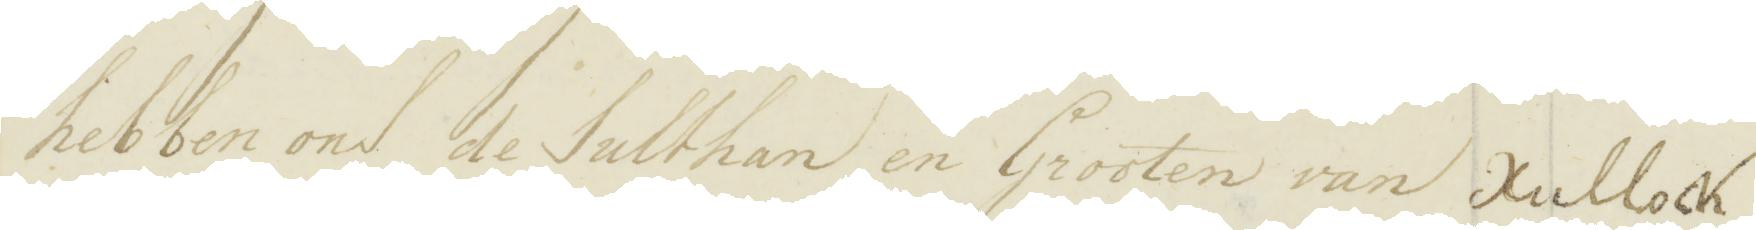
hebben ons de sulthan en Grooten van Xullock
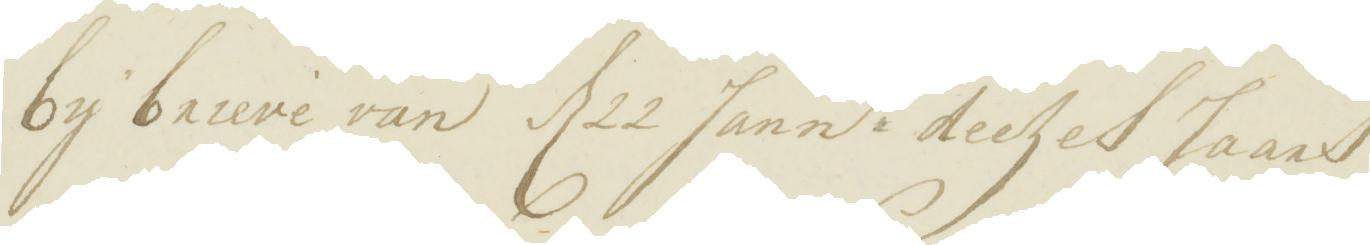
by brieve van E22 Jann: deezes Jaars
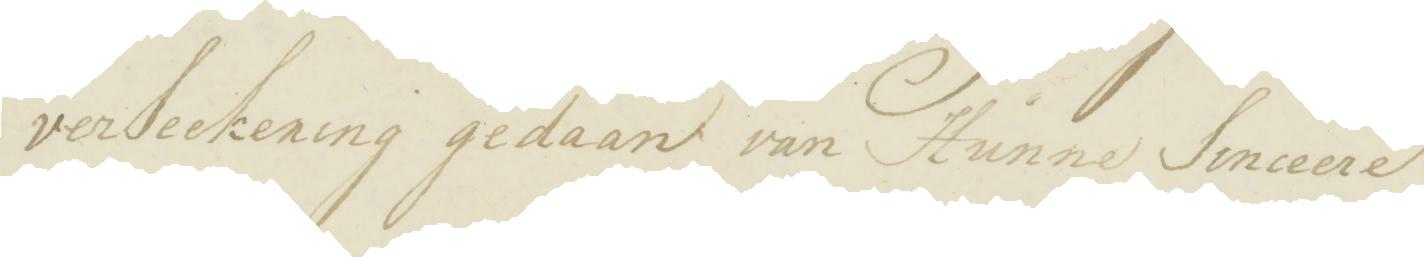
verseekering gedaan van Hunne Sinceere
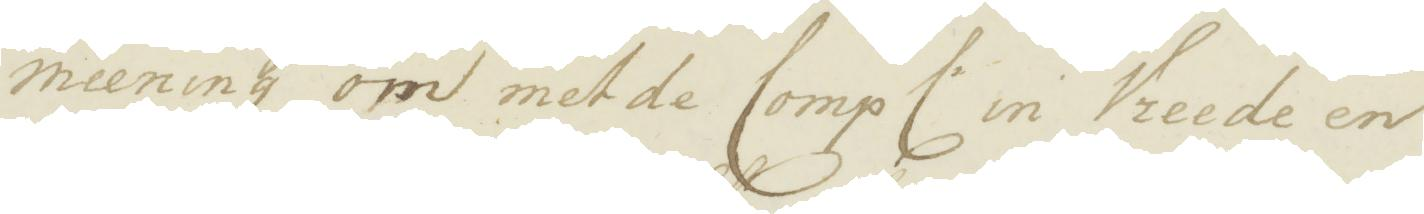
meening om met de Comp C in Vreede en
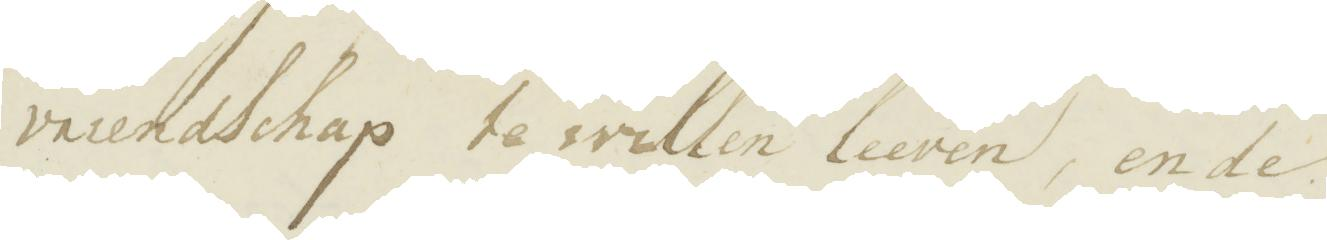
vriendschap te willen leeven, en de
